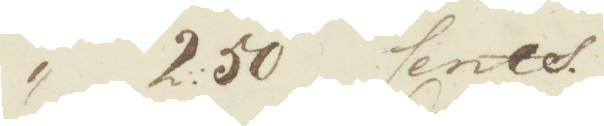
„ 2: 50 Cents.
